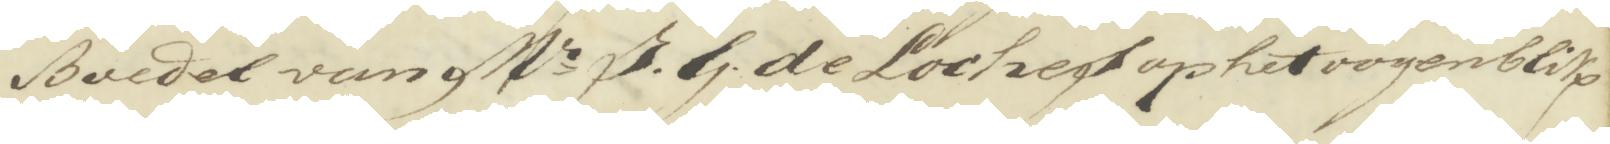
Boedel van M=r J. G. de Loches op het oogenblik
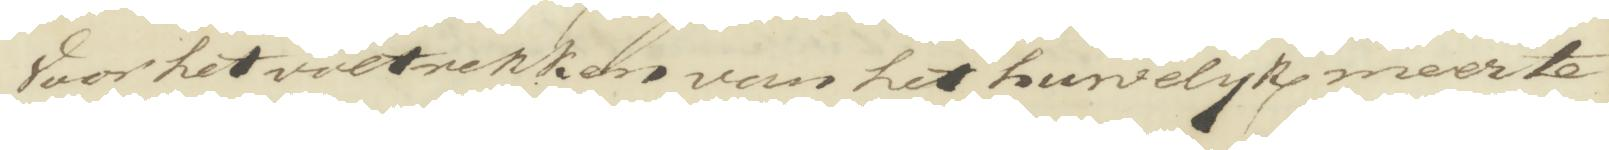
voor het voltrekken van het huwelyk meer te
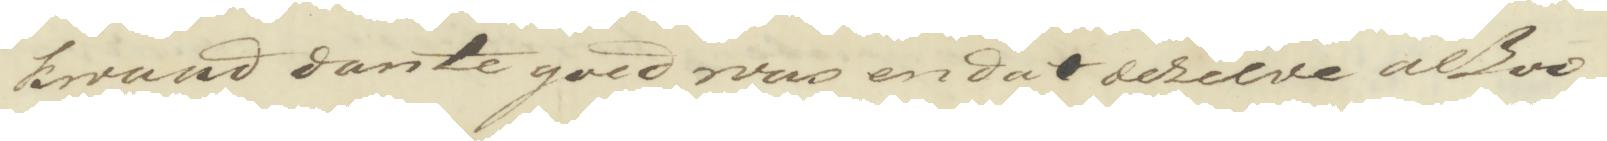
kwaad dan te goed was en dat dezelve alZoo
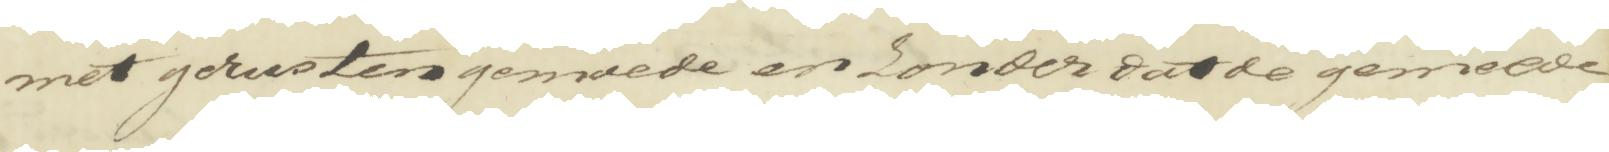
met gerusten gemoede en Zonder dat de gemelde
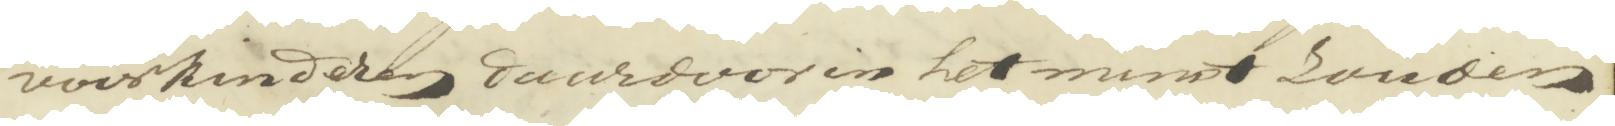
voorkinderen daardoor in het minst zouden
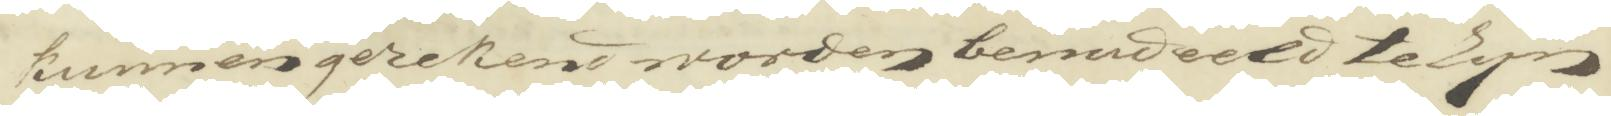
kunnen gerekend worden benadeeld te zyn
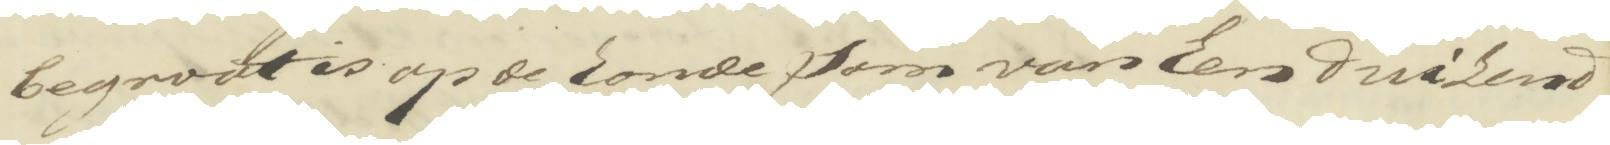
begroot is op ronde som van Een duizend
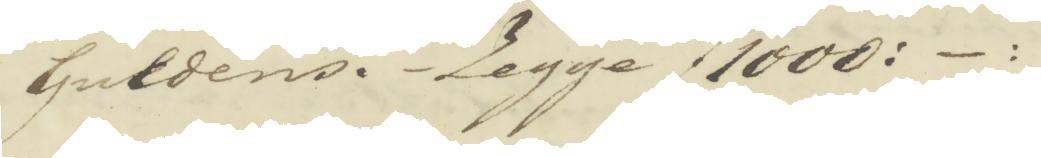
Guldens.- Zegge ƒ1000: —:
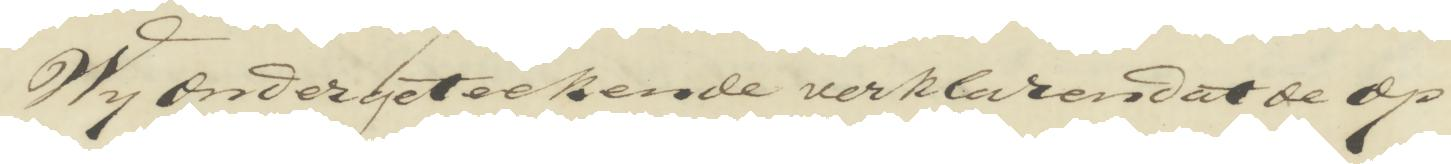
Wy onder geteekende verklaren dat de op
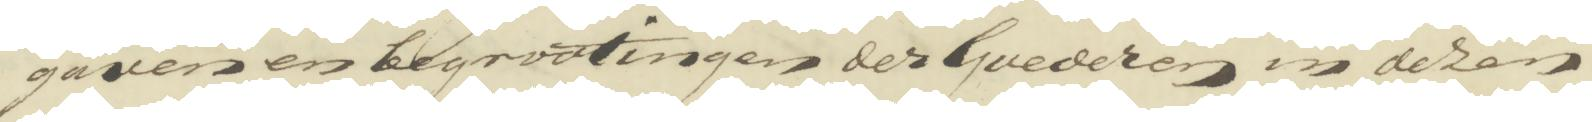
gaven en begrootingen der Goederen in dezen
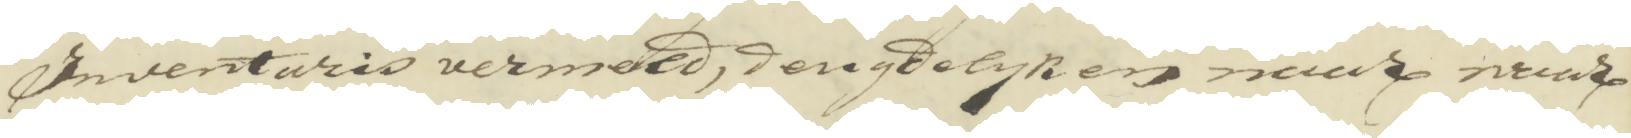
Inventaris vermeld, deugdelyk en naar waar
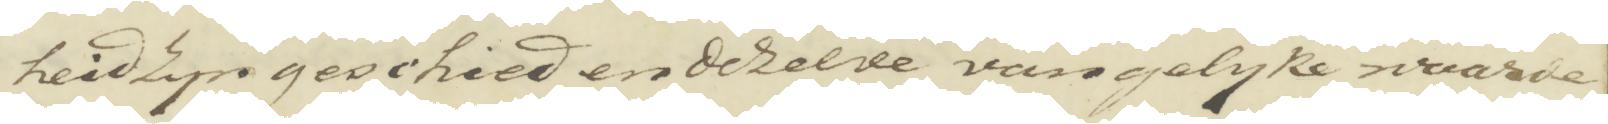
heid zyn geschied en dezelve van gelyke waarde
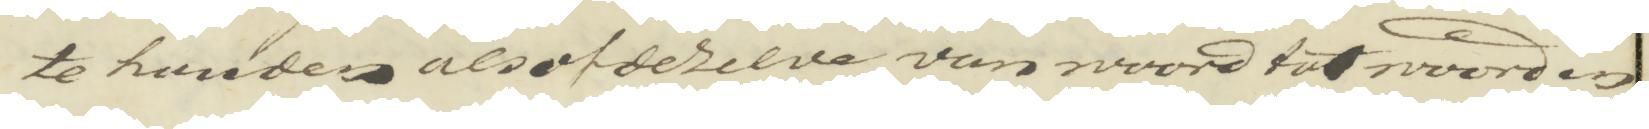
te houden als of dezelve van woord tot woord in
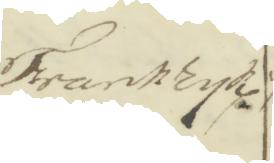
Frankryk
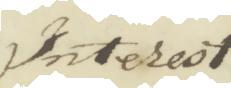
Interest
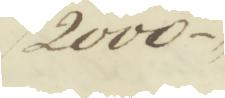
ƒ 2000-„
